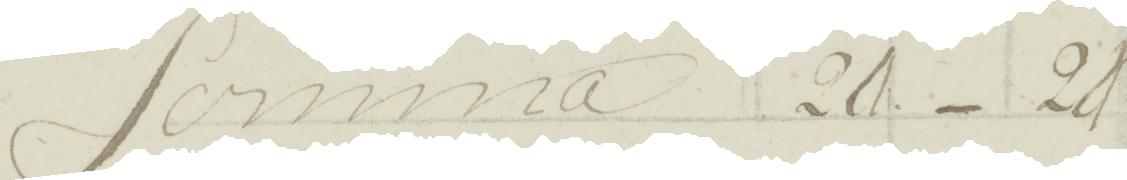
Somma 24: — 24
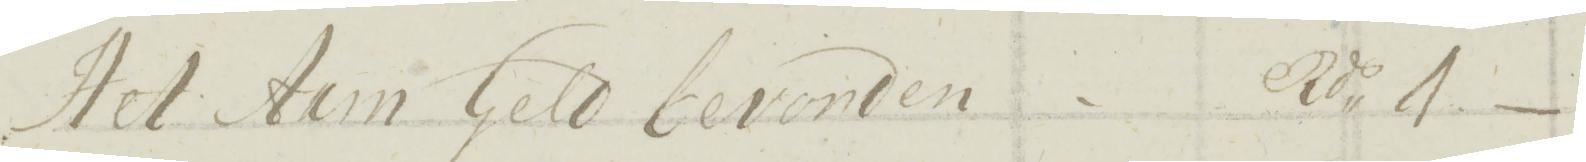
Het Arm Geld bevonden - Rd„s 4._
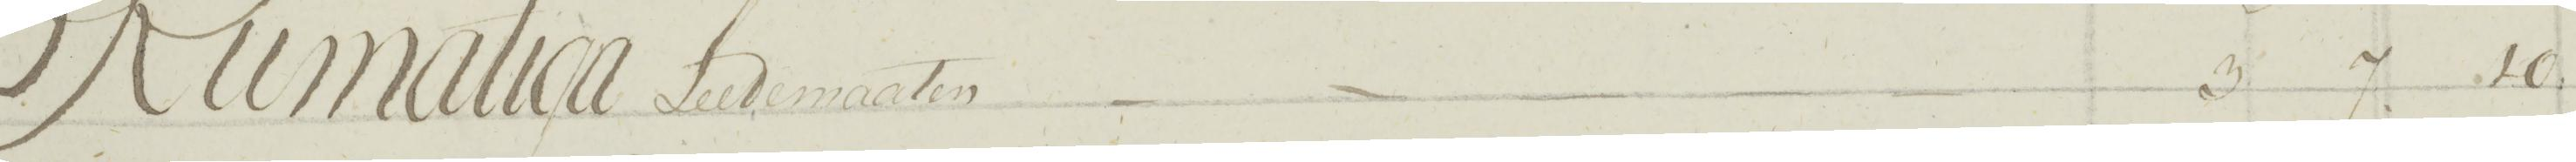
Rumatiga Leedemaaten — — — — — 3. 7. 10:
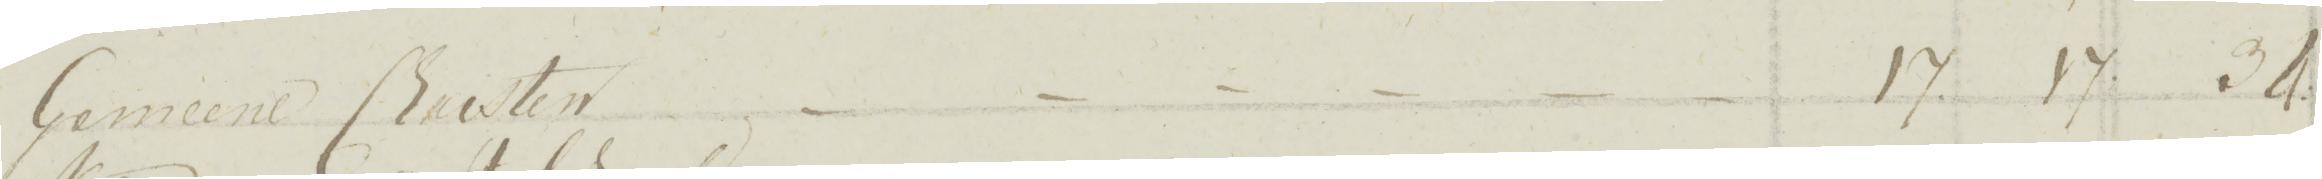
Gemeene Christen - - - - — 17. 17. 34:
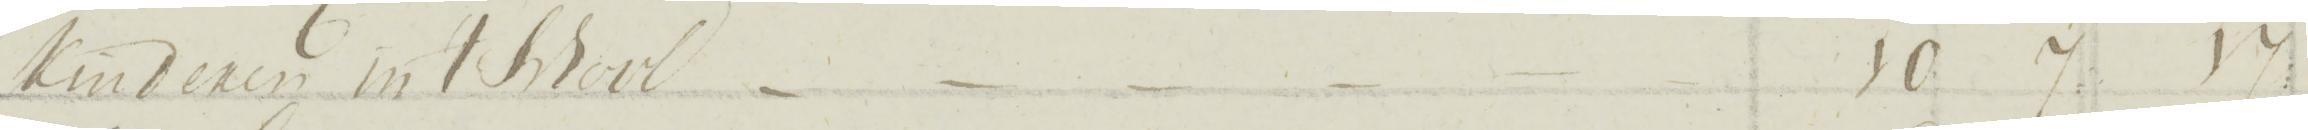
Kinderen in 't School - — — — — -10: 7: 17:
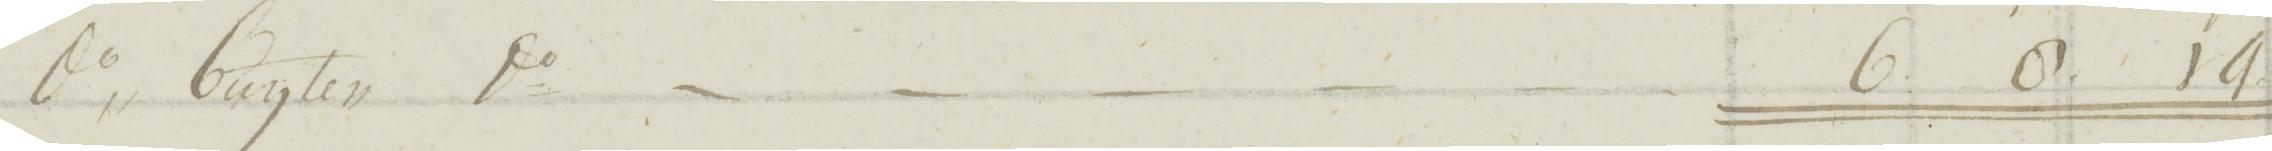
d„o buijten d=o 6: 8. 14.
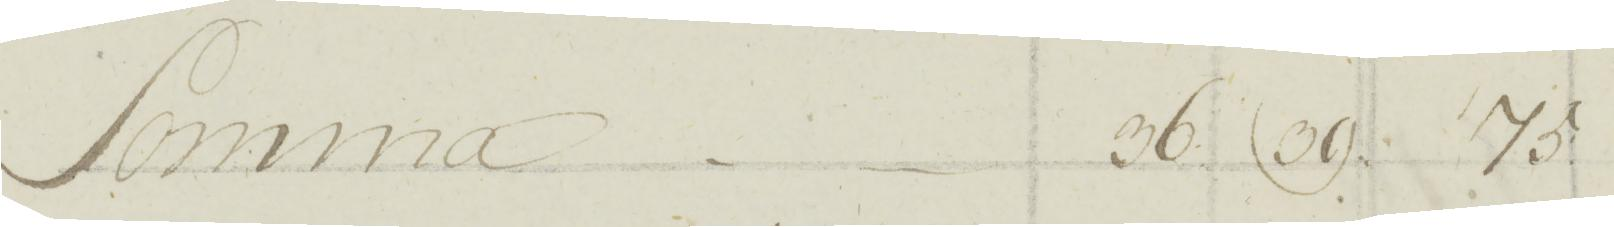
Somma - - 36: 39: 75:
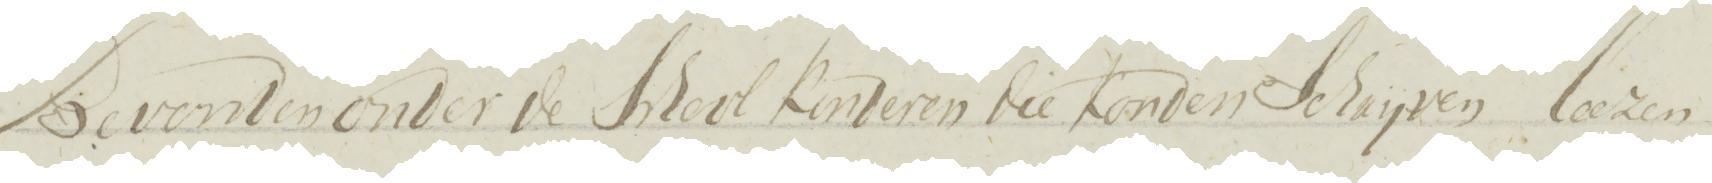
Bevonden onder de School Kinderen die konden schrijven leezen
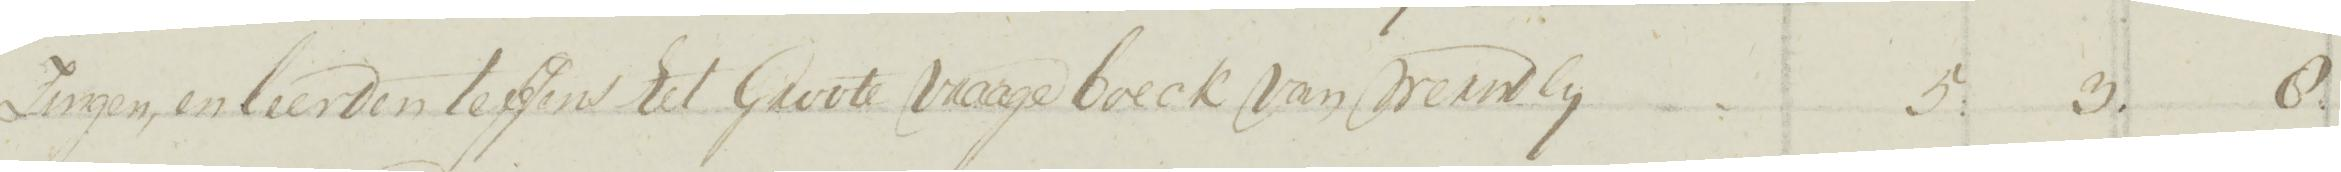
Zingen, en leerden teffens het Groote vraage boeck van werndlij 5: 3, 8:
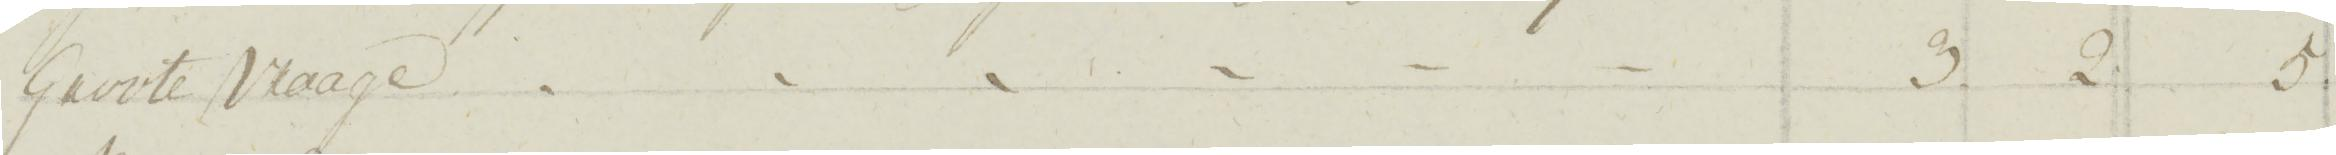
Groote Vraage . - - - - - 3. 2: 5.
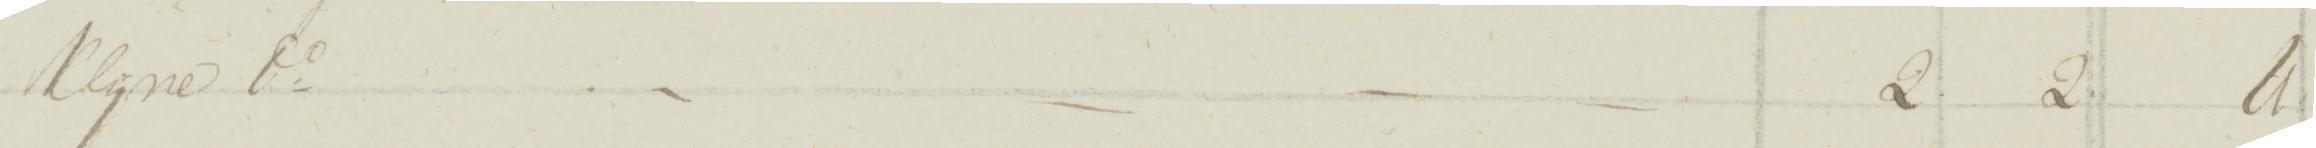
Klijne d=o - — — — 2: 2: 4:
